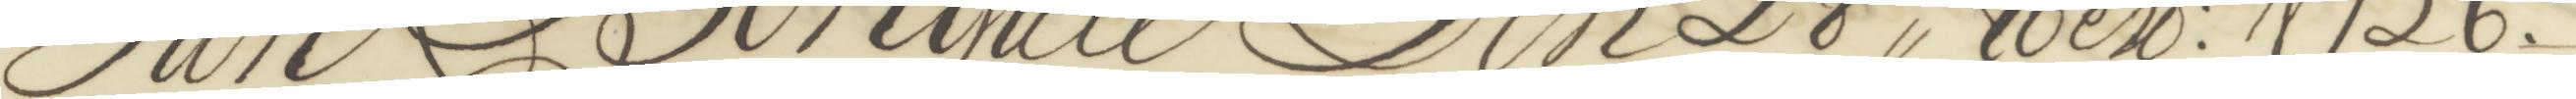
Van Bengale Den 28„en 7ber: 1726.
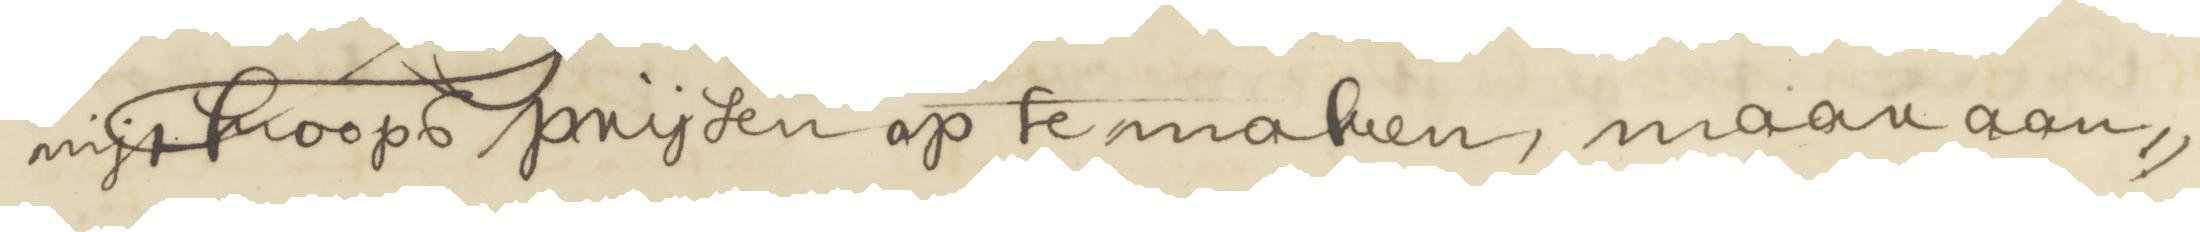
uijtkoops prijsen op te maken, maar aan„
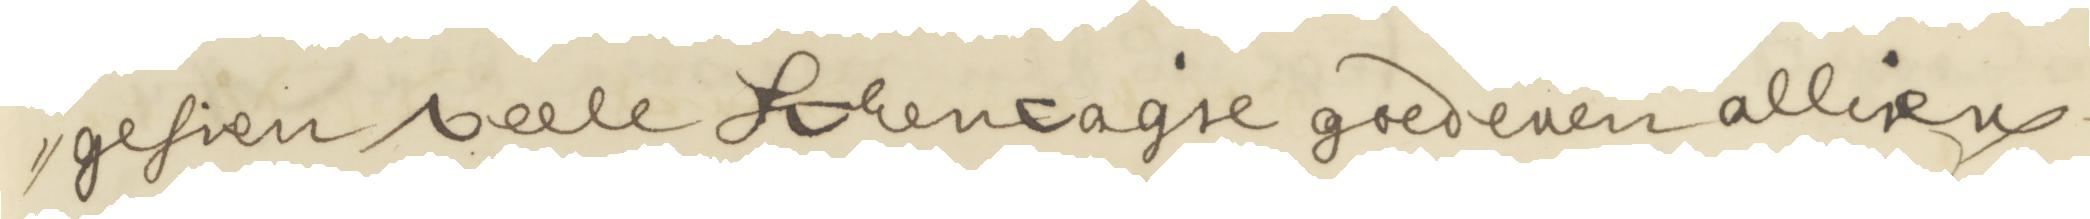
„gesien veele schencagie goederen alhier
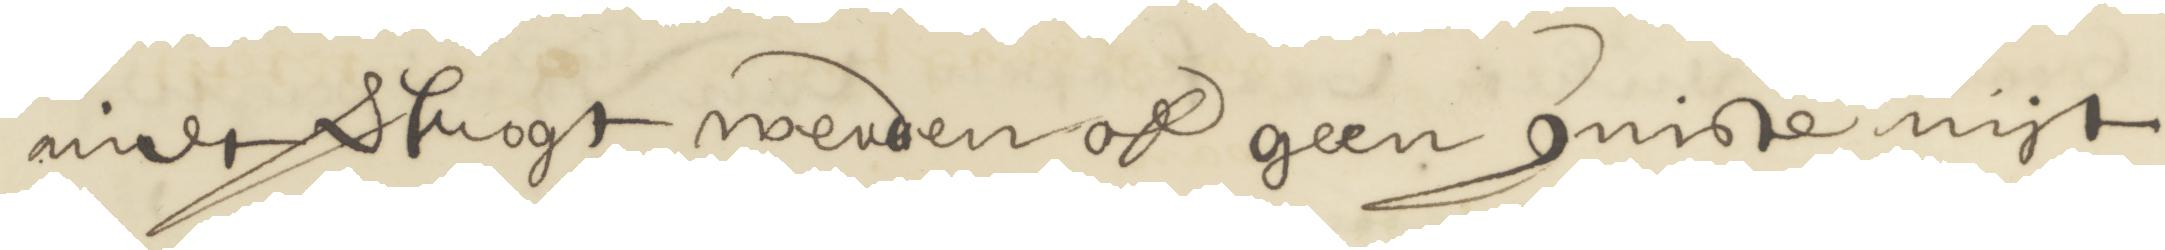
niet verkogt werden of geen Juiste uijt
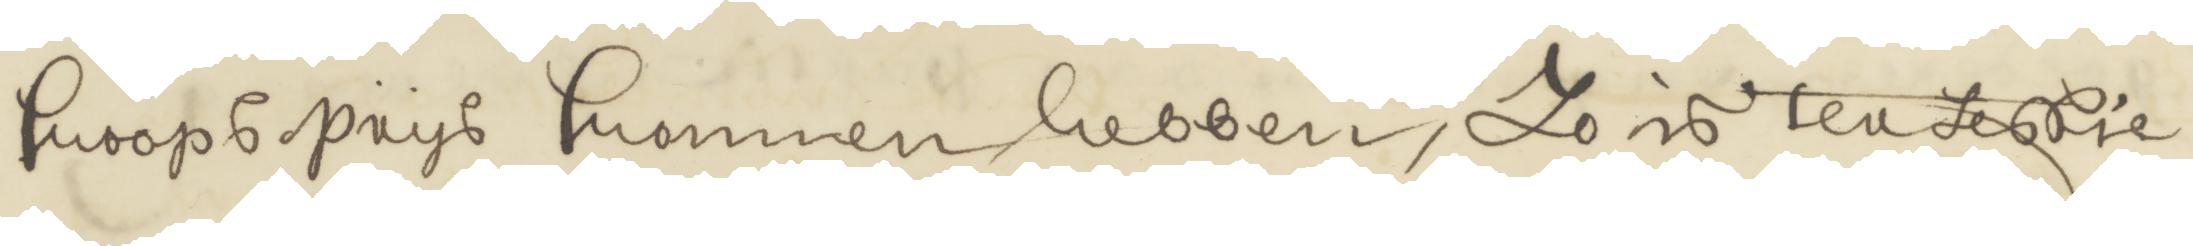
koopsprijs konnen hebben, zo is ter sessie
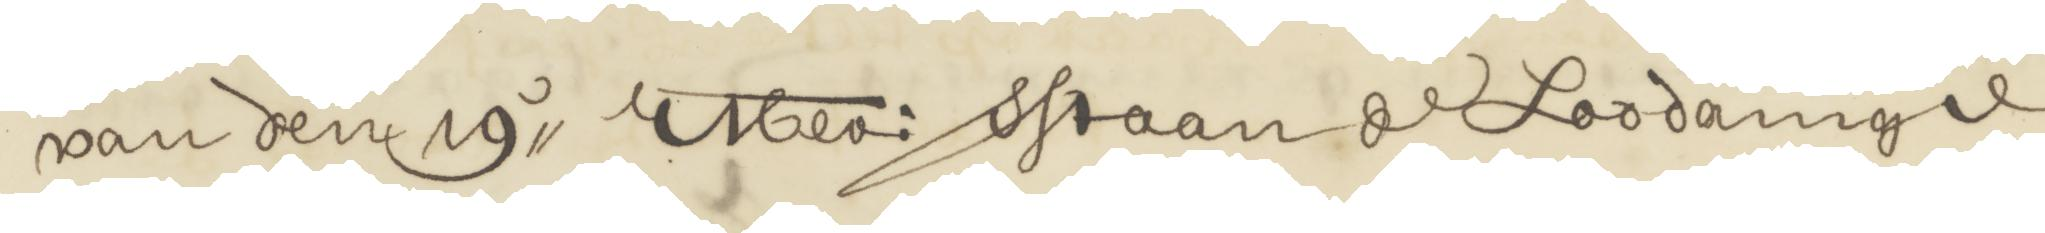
van den 19„e 7tber: verstaan de soodanige
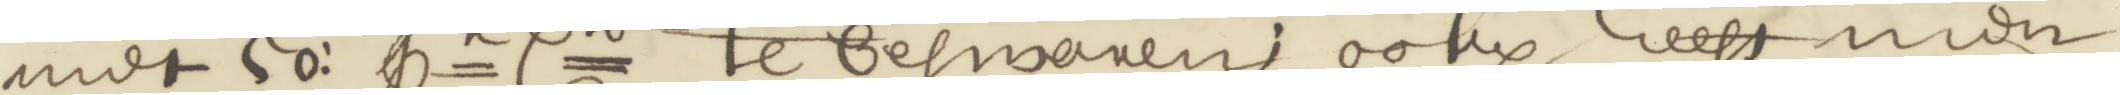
met 50: p=r C=to te beswaren, ook heeft men
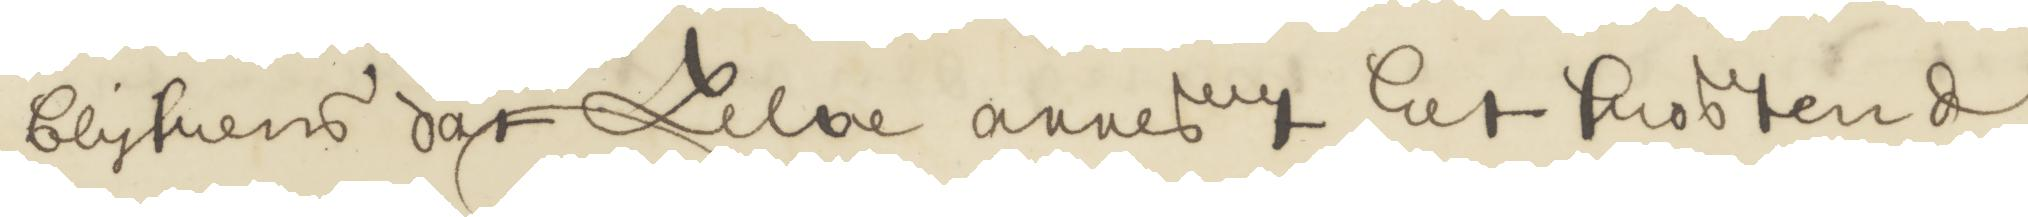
blijkens dat Zelve arrest het kosten de
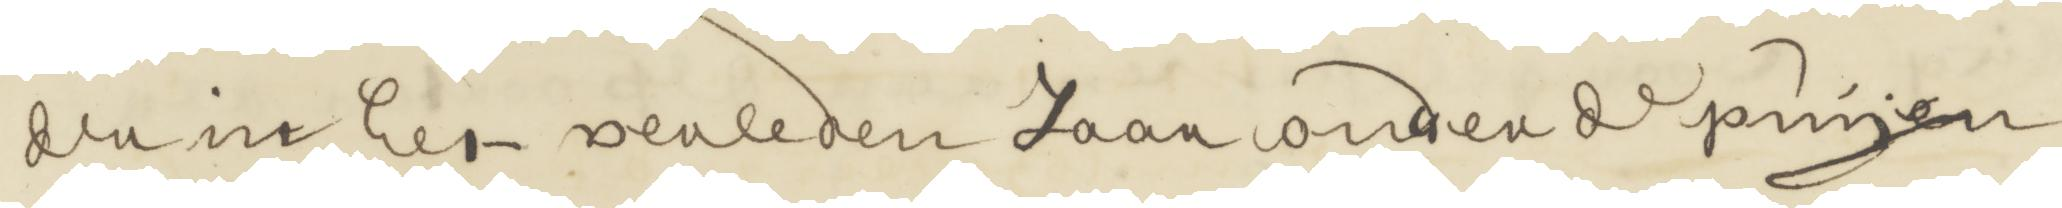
der in het verleden Iaar onder de puijen
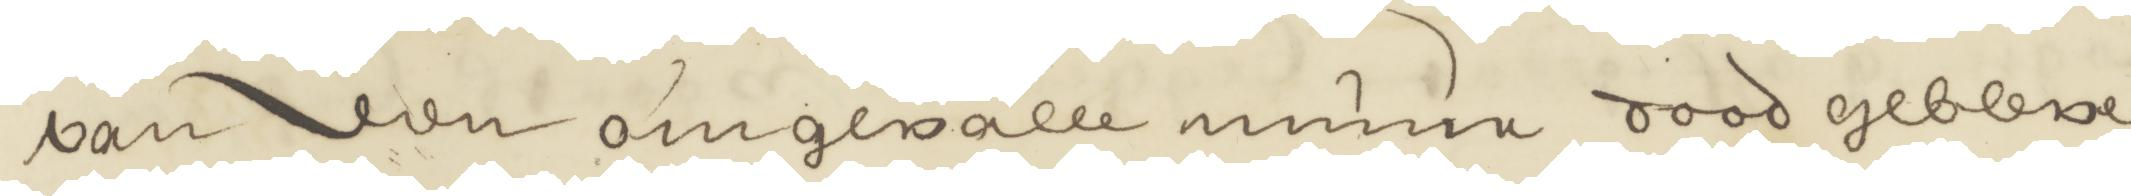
van Een omgevalle muur dood gebleve
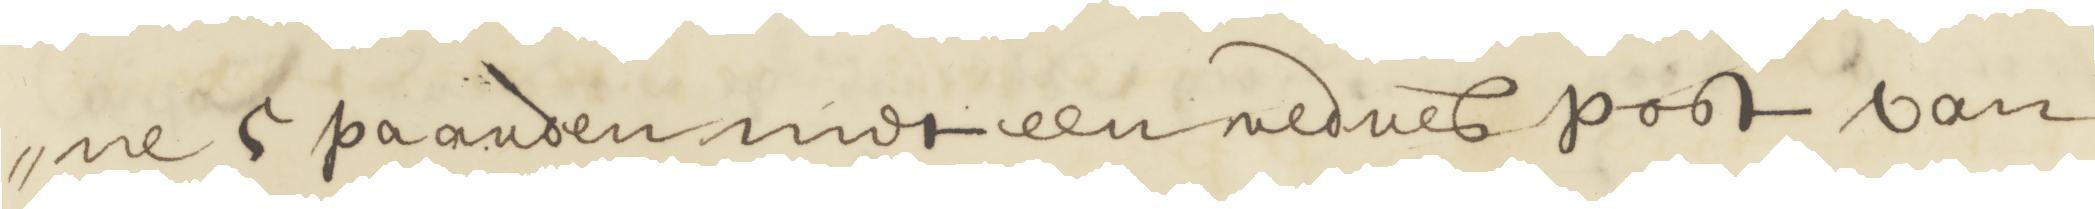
„ne 5 paarden met een redres post van
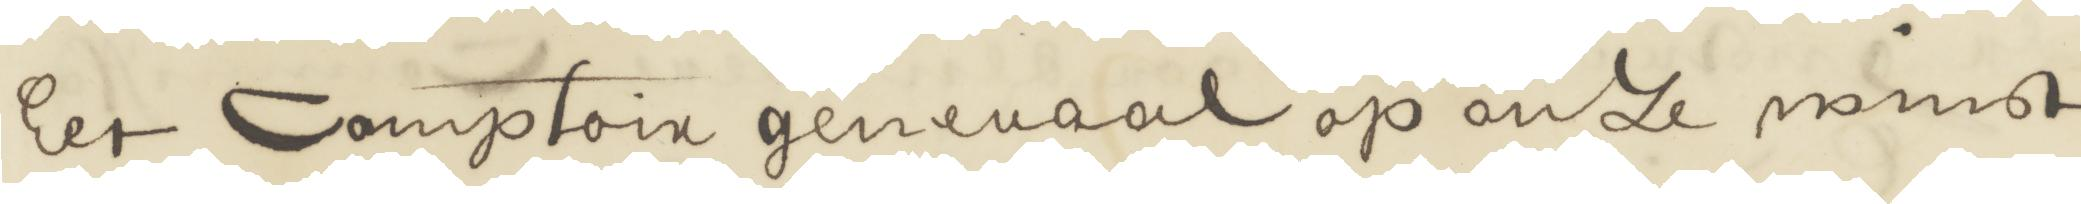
het Comptoir generaal op onze winst
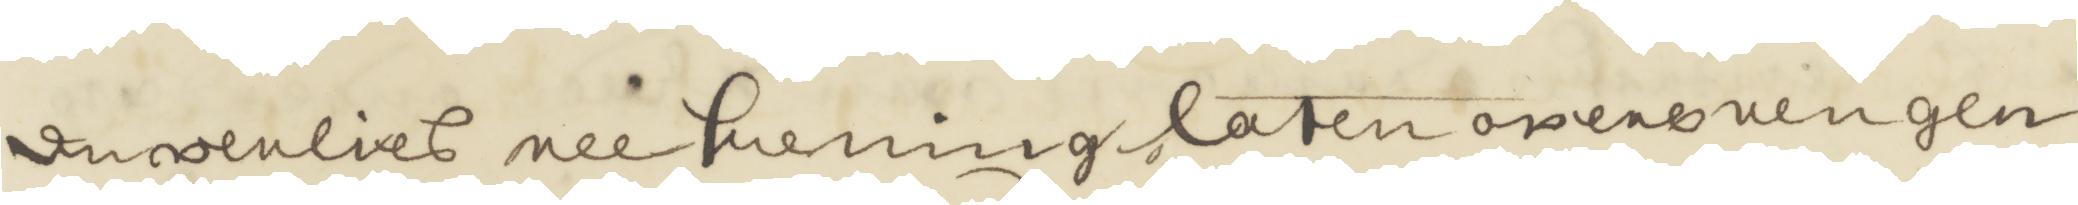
en verlies reekening laten overbrengen
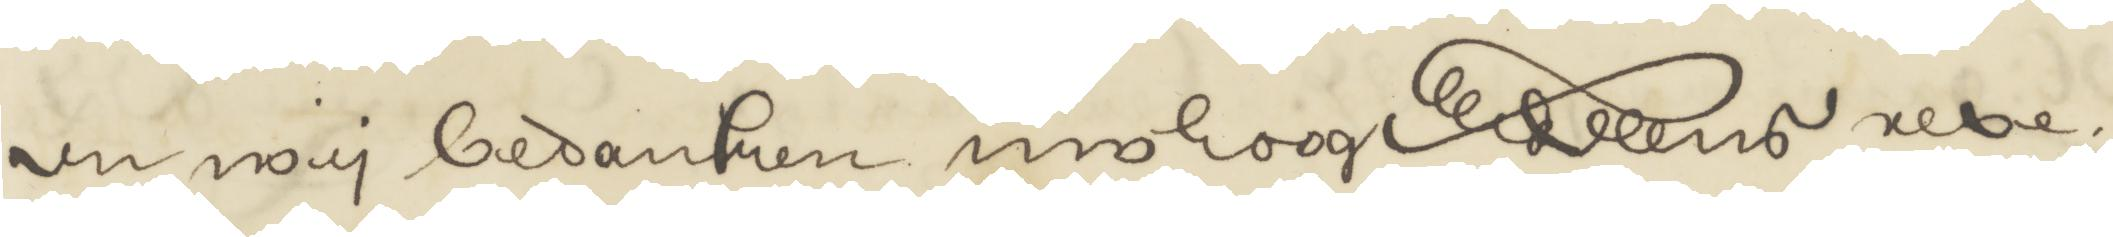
en wij bedanken uw hoog Edelens reve,
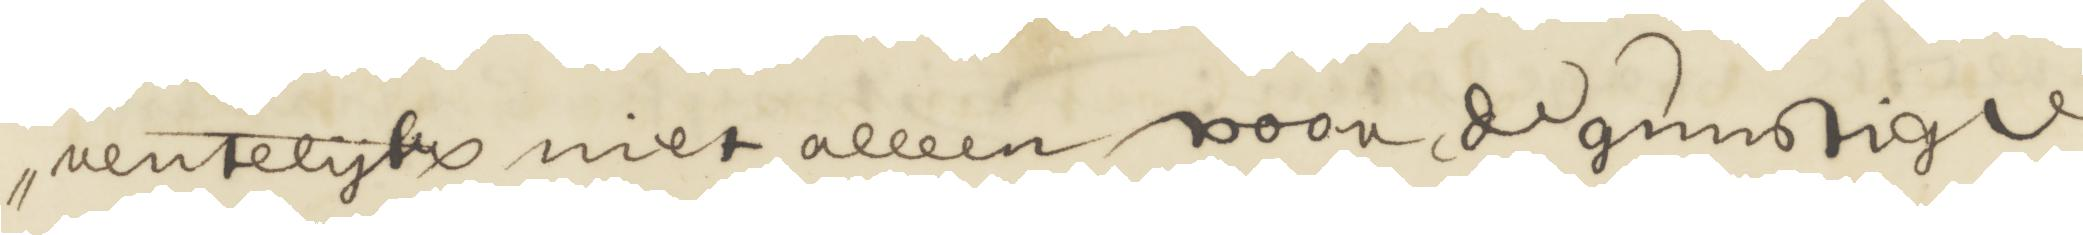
„rentelijk niet alleen voor de gunstige
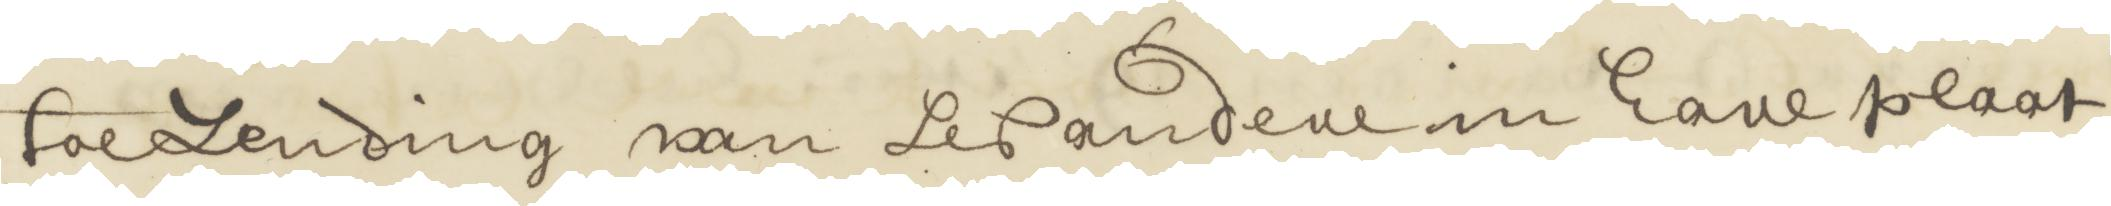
toezending van ses andere in hare plaat
